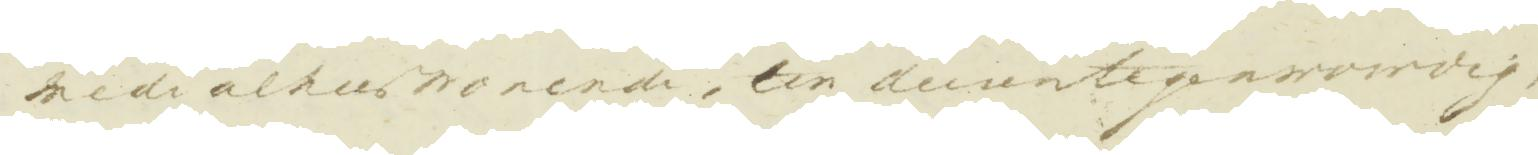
mede alhier wonende, ten deesen tegenwoordig,
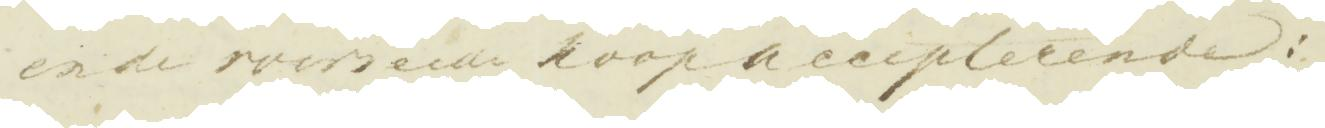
ende voorseide koop accepterende:
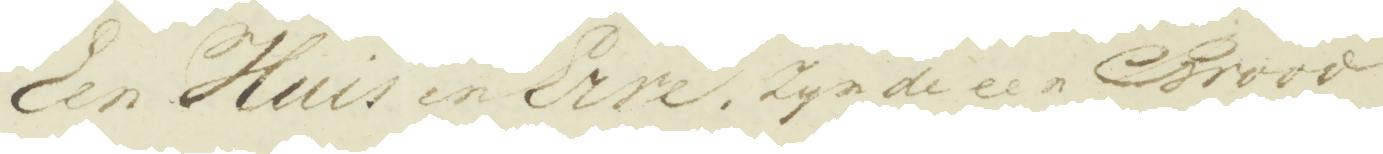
Een Huis en Erve, zynde een Brood
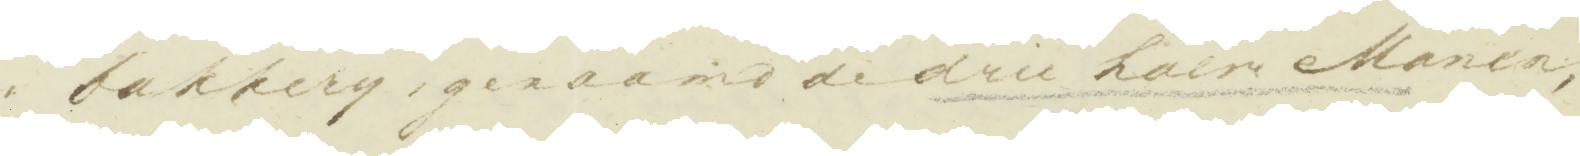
„ bakkery, genaamd de drie halve Manen,
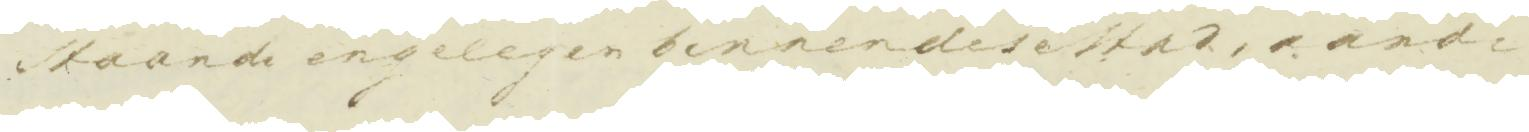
staande en gelegen binnen dese stad, aande
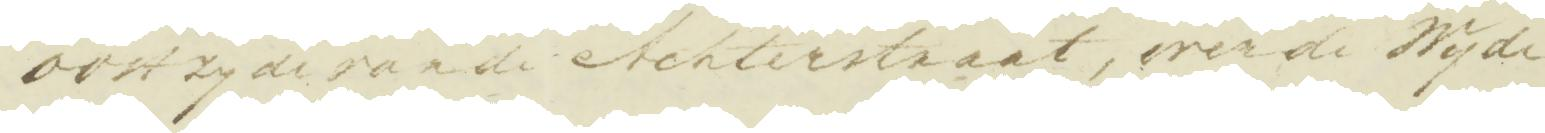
oost zyde van de Achterstraat, over de Wyde
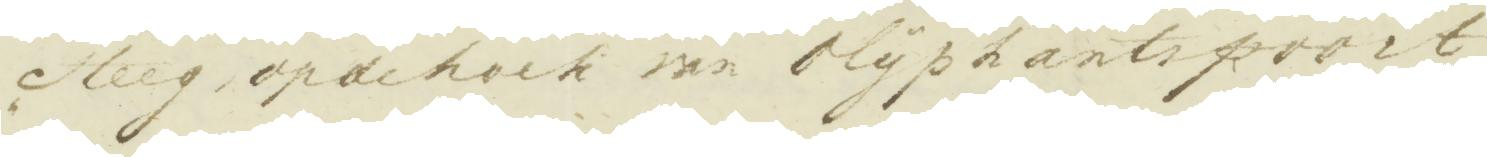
steeg, op de hoek van Olijphants poort
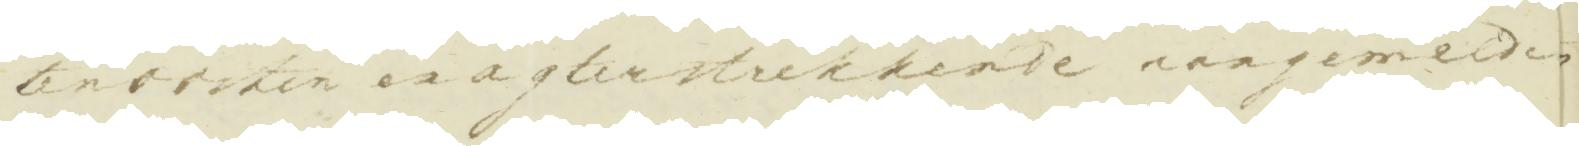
ten oosten en agterstrekkende aan gemelden
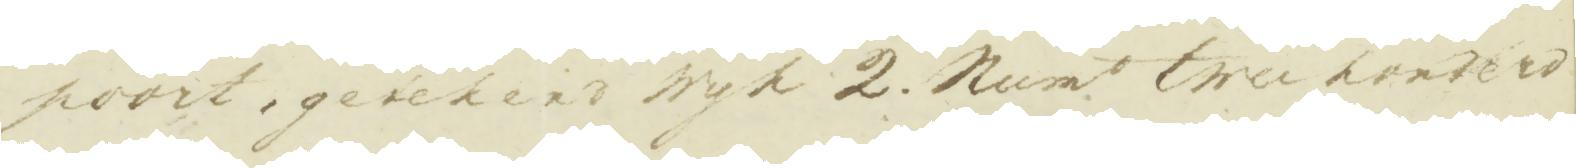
poort, getekend wyk 2. Num„o twee honderd
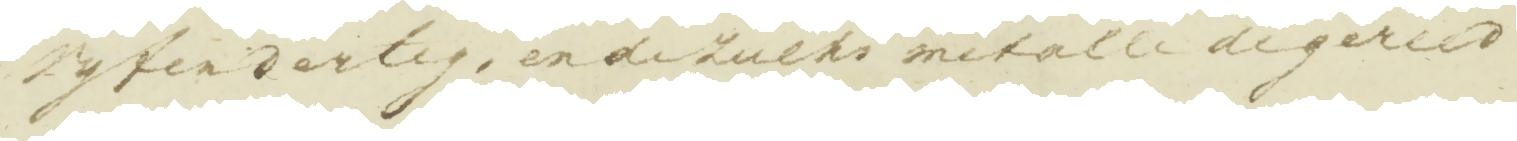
vyfen dertig, ende zulks met alle de gereed
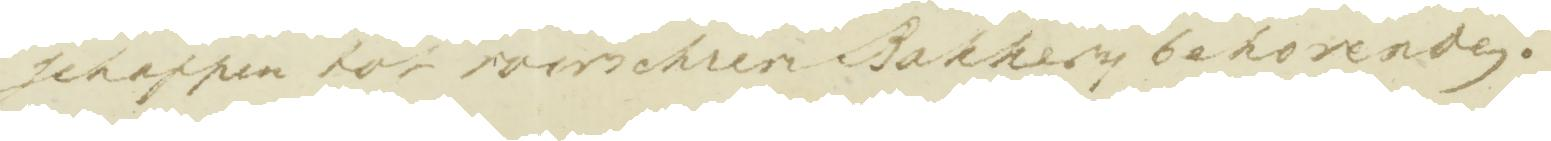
schappen tot voorschreve Bakkery behorenden.
